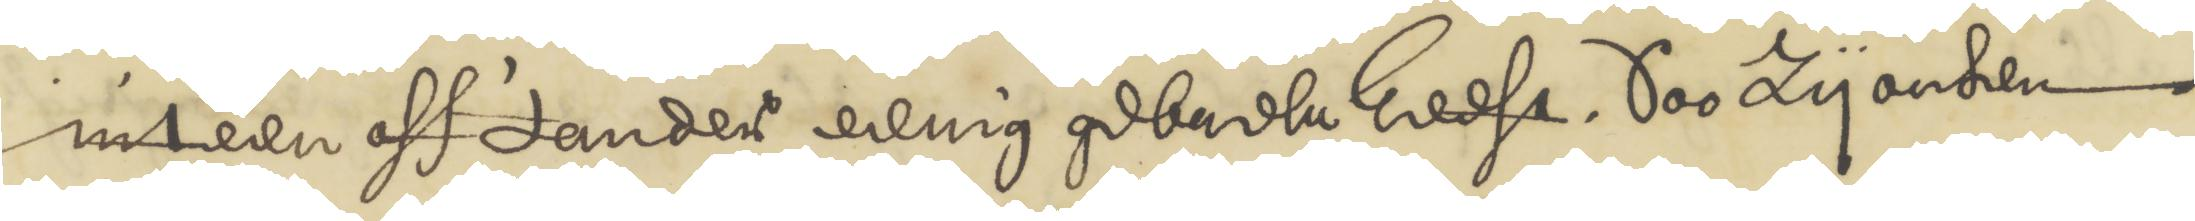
in´teen off 'tander eenig gebrek heeft, soo zij onsen
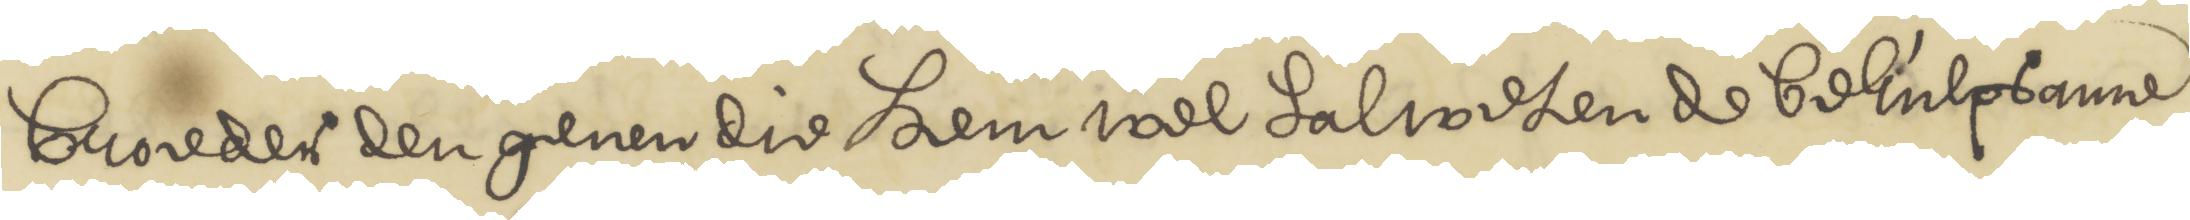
broeder den genen die hem wel sal wesen de behulpsame
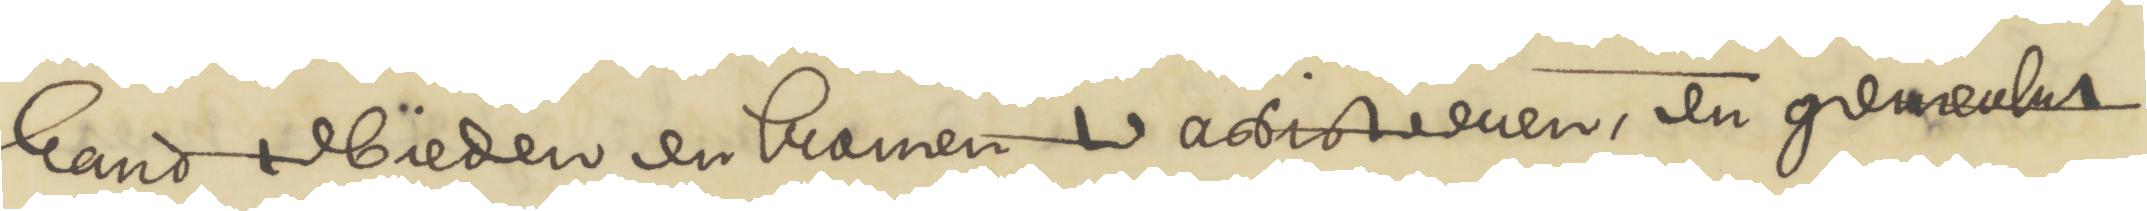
hand tebieden en komen te assisteeren, en gemerkt
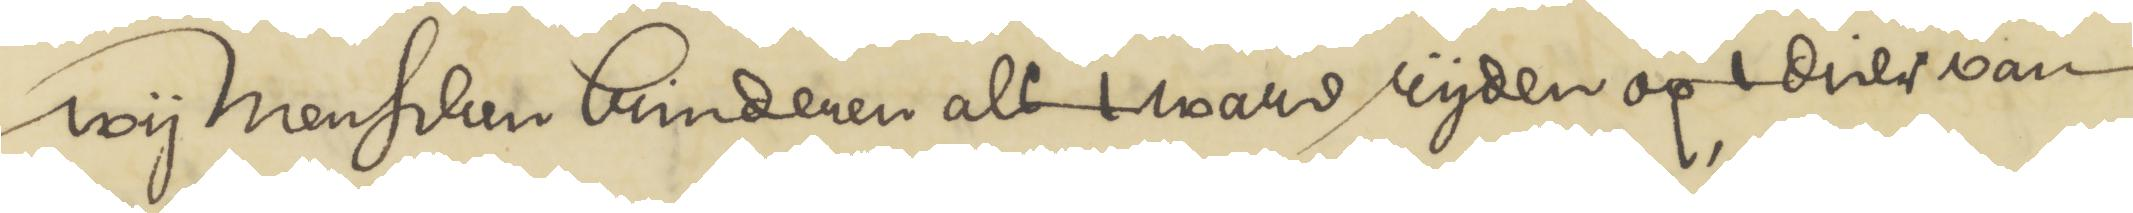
wij menschen kinderen als 'tware rijden op 't dier van
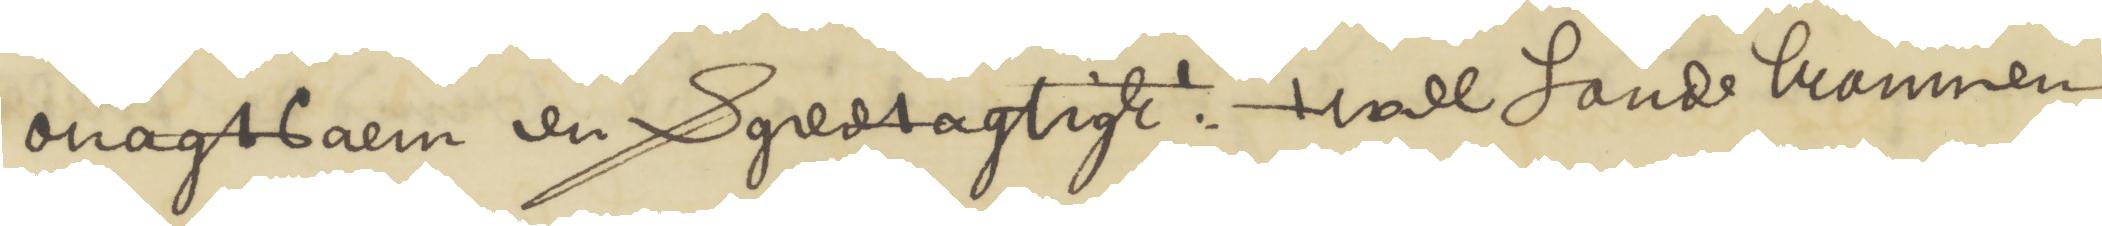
onagtsaem en vergeetagtigh:t 'twel soude konnen
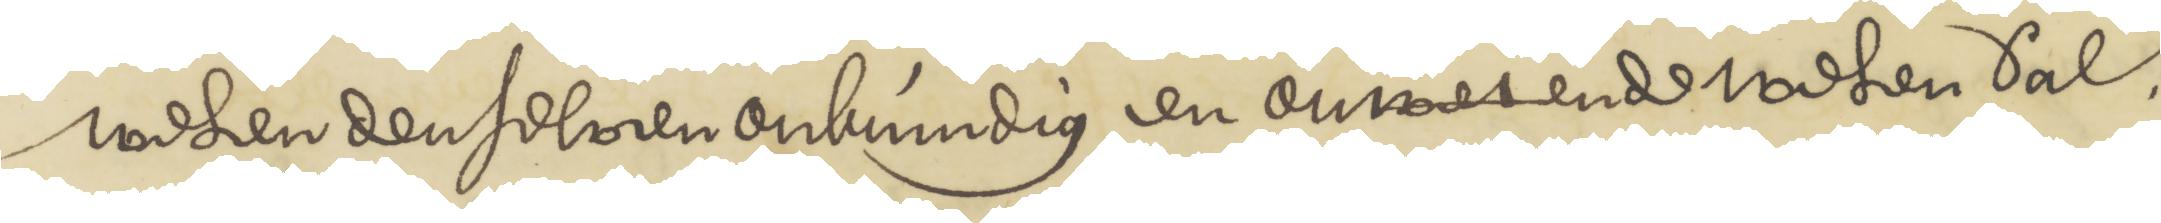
wesen den selven onkundig en onwetende wesen sal,
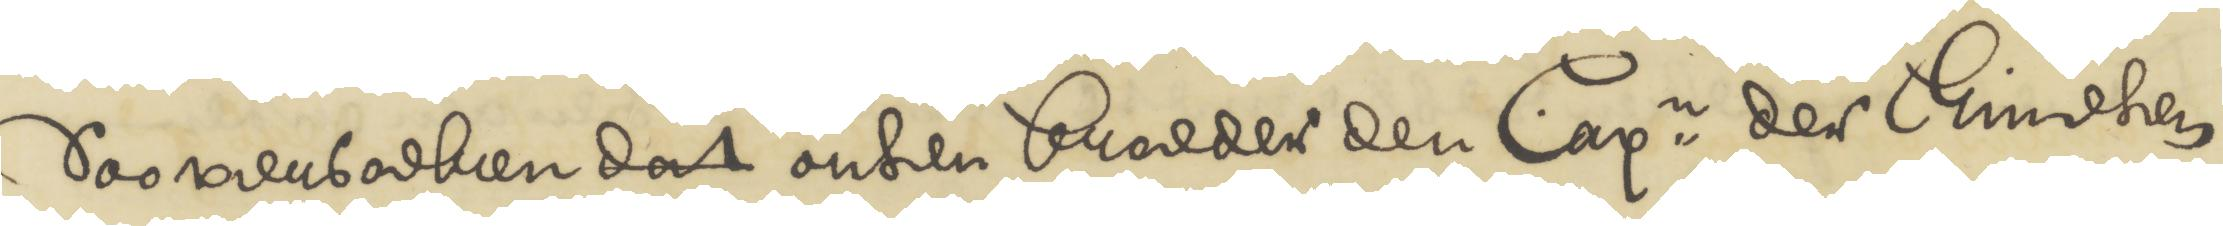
soo versoeken dat onsen broeder den Cap„n der chinesen
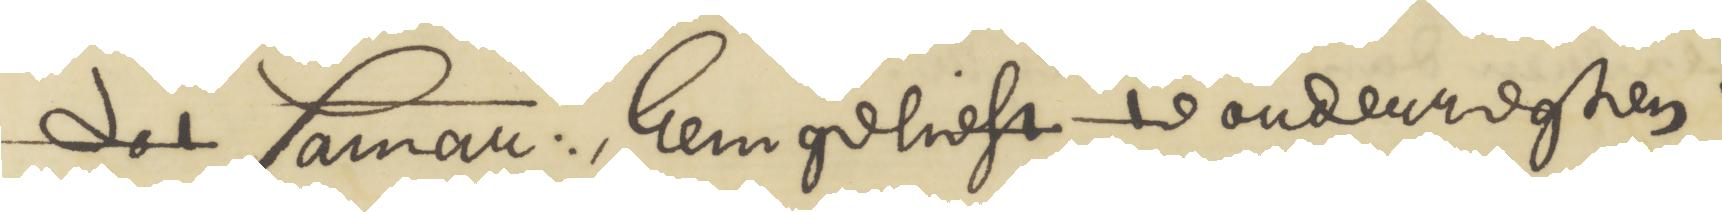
tot Saman:, hem gelieft te onderregten
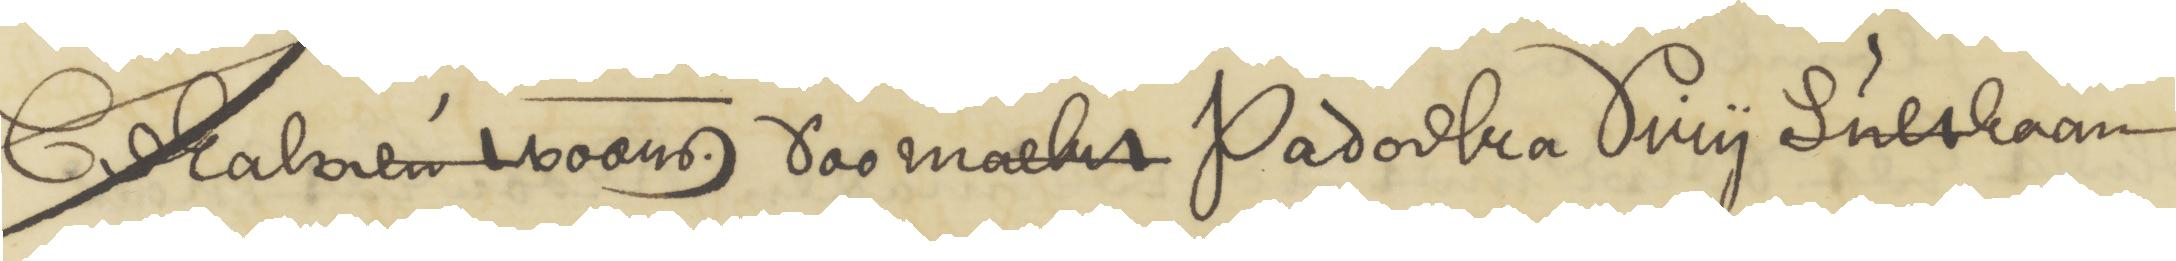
behalven 'tvoors soo maekt Padoeka Sirij Sulthaan
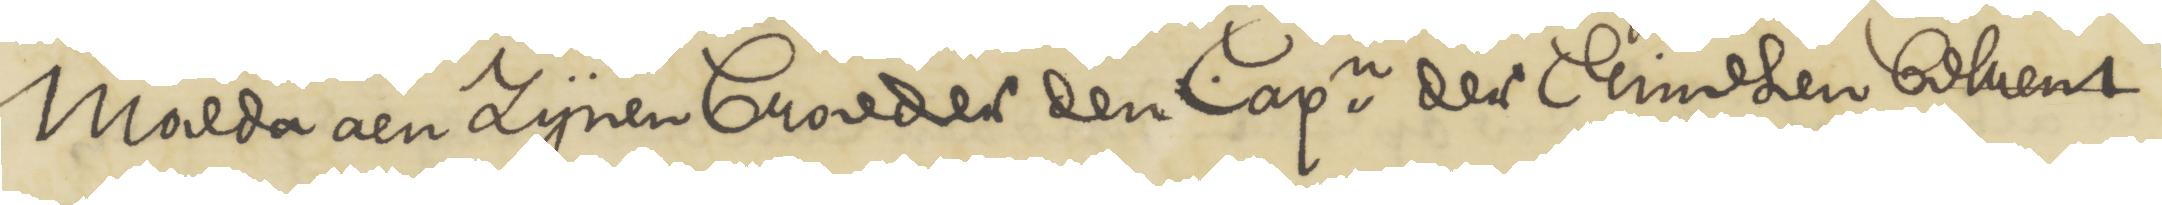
Malda aen zijnen broeder den Cap„n der chinesen bekent
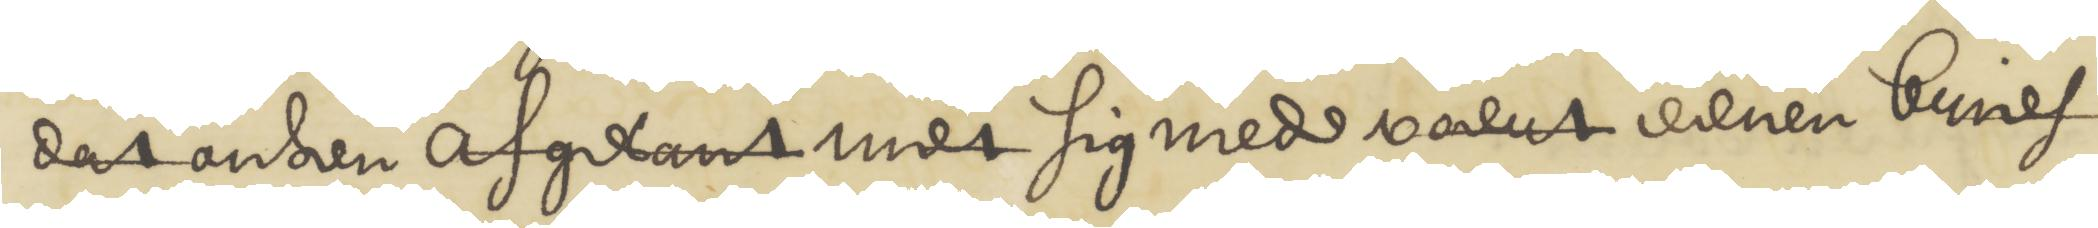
dat onsen afgesant met sig mede voert eenen brief
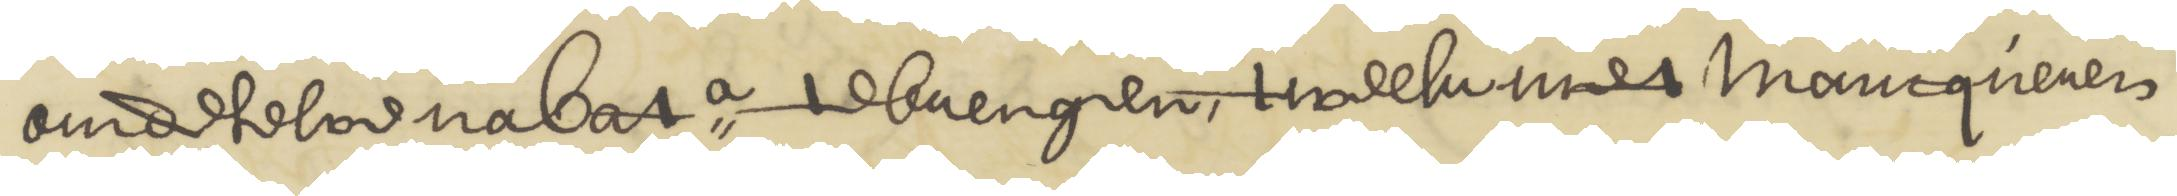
om deselve na bat„a tebrengen, 'twelk niet mancqueren
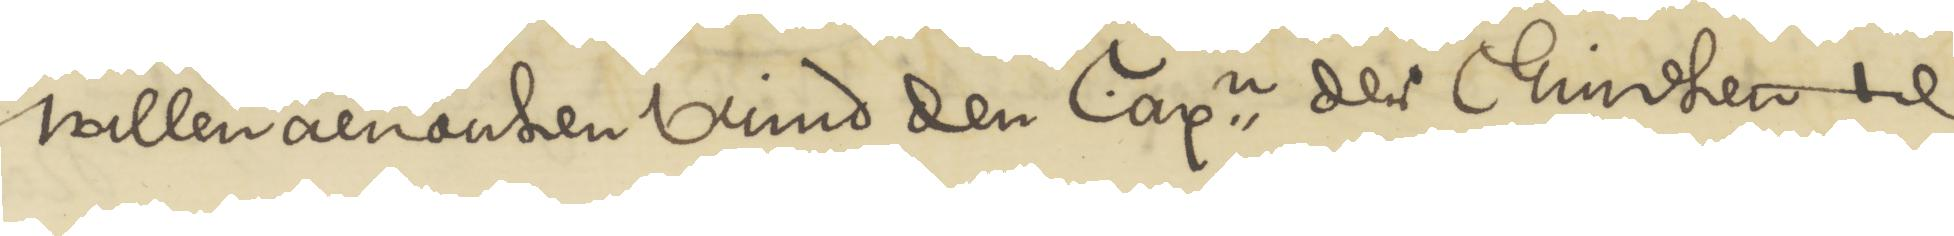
willen aen onsen vrind den Cap„n der chinesen te
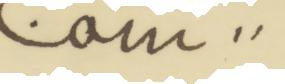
Com„
